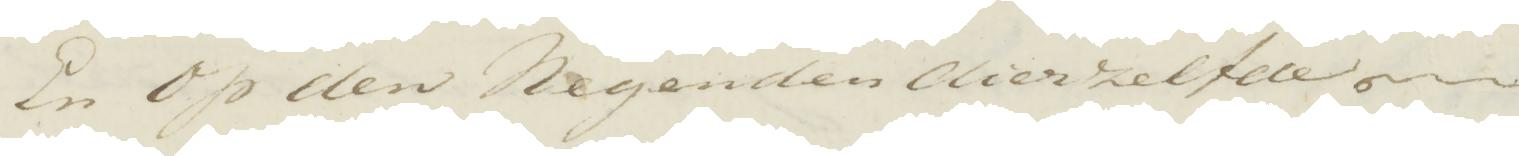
En op den Negenden dierzelfde
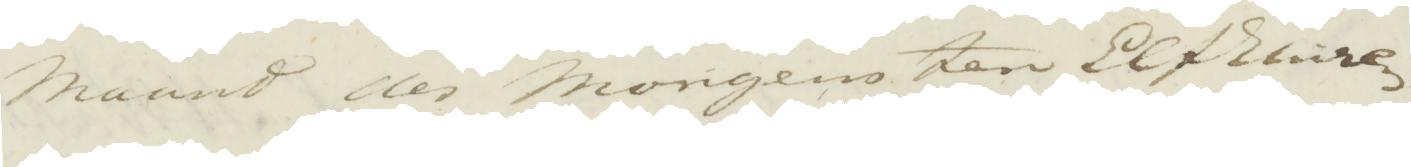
maand des morgens ten Elf uuren
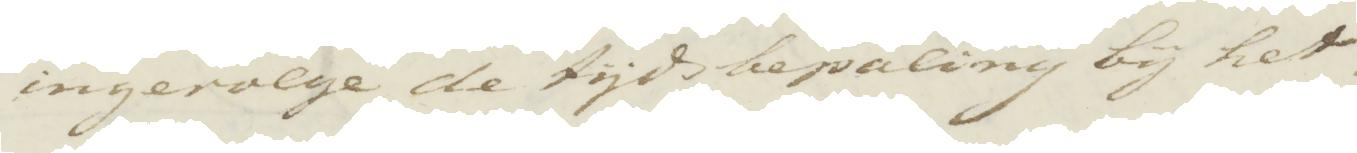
ingevolge de tijdsbepaling bij het
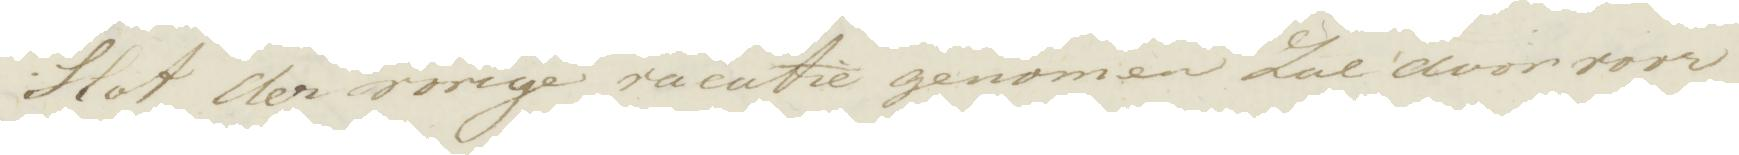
slot der vorige vacatie genomen zal door voor
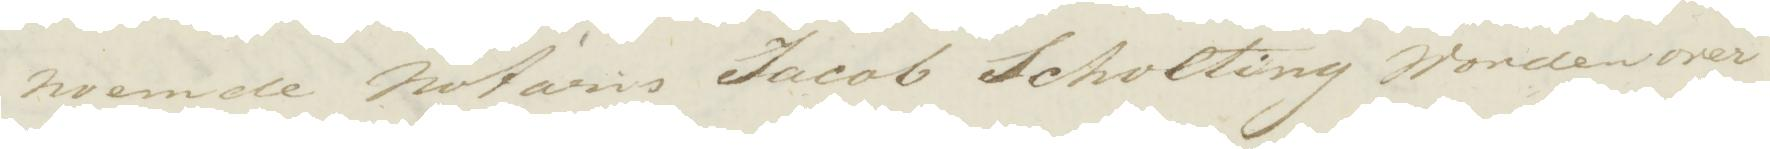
noemde notaris Jacob Scholting worden over
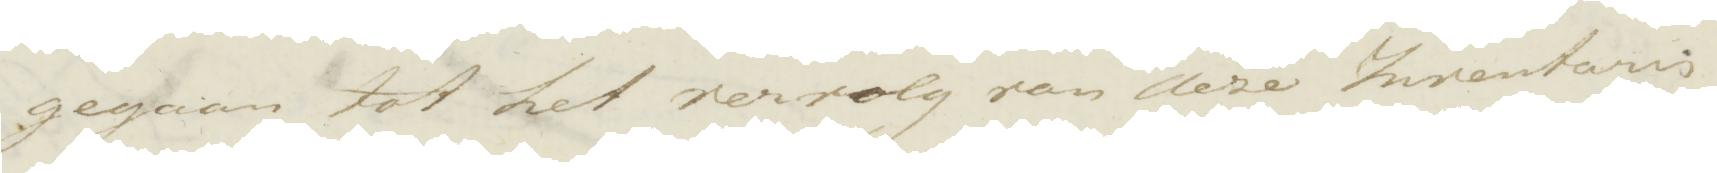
gegaan tot het vervolg van deze Inventaris
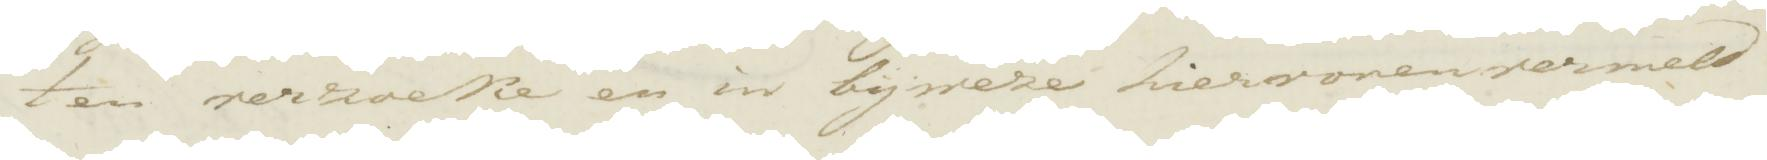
ten verzoeke en in bijweze hiervoren vermeld
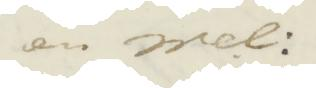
en wel:
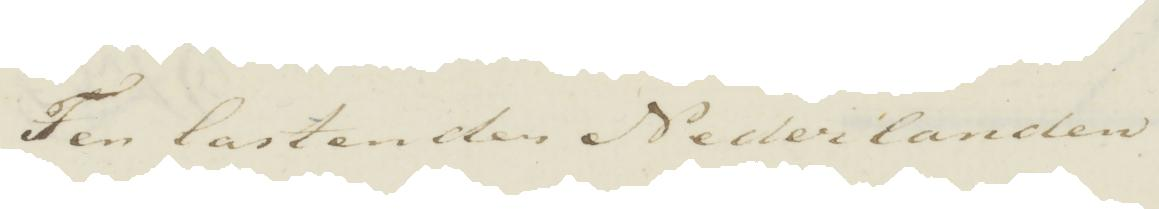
Ten lasten den Nederlanden
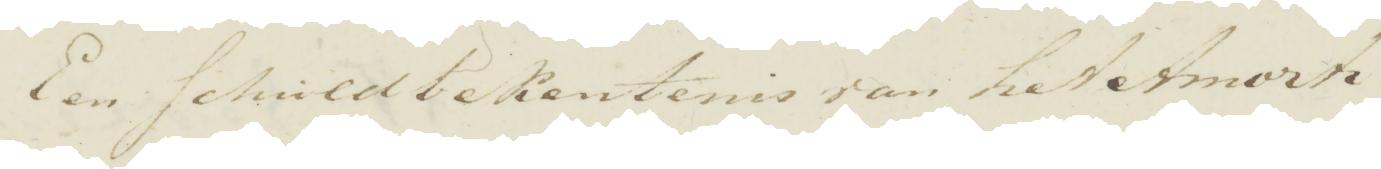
Een schuldbekentenis van het Amorti
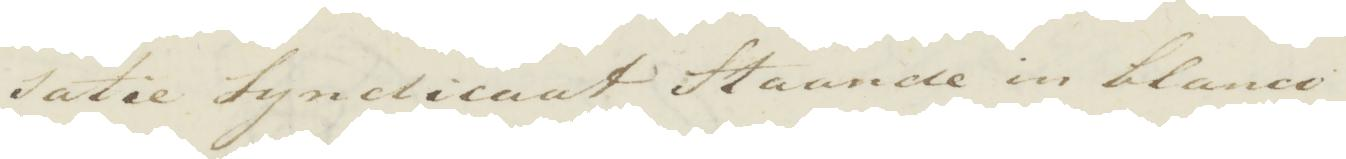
satie syndicaat staande in blanco
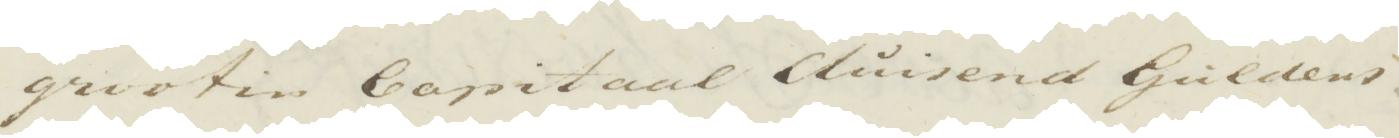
groot in Capitaal duisend Guldens,
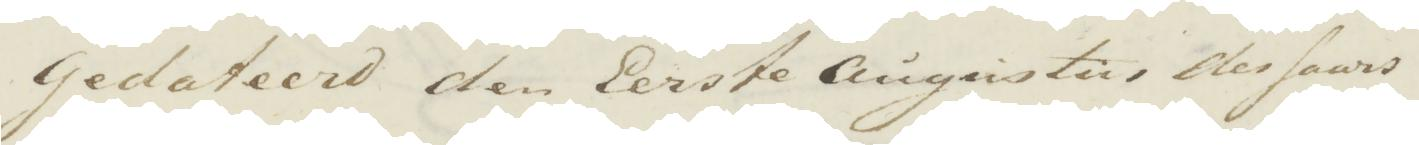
Gedateerd den Eerste Augustus des jaars
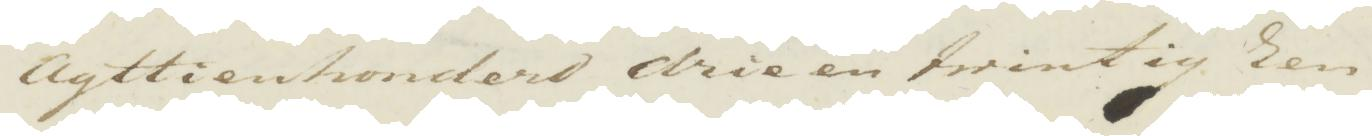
Agttienhonderd drie en twintig ren
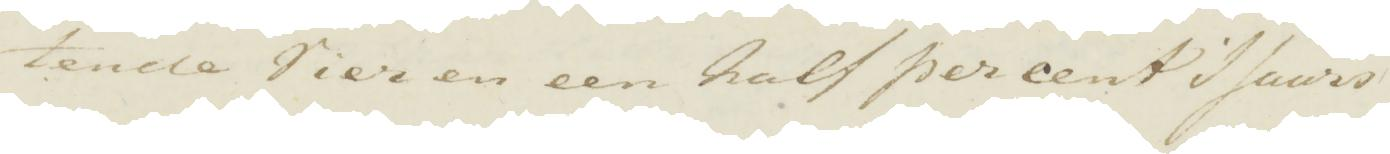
tende Vier en een half per cent 's Jaars
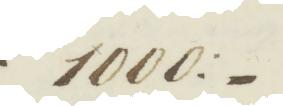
ƒ 1000: _
